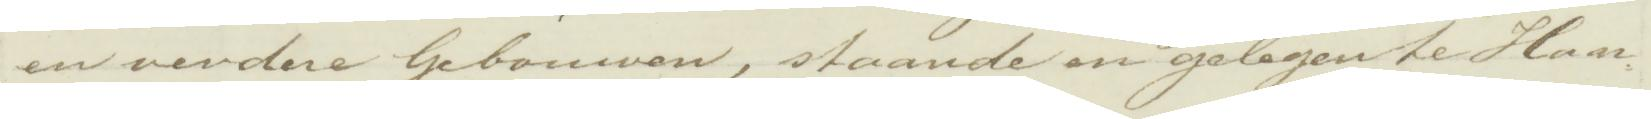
en verdere Gebouwen, staande en gelegente Haar
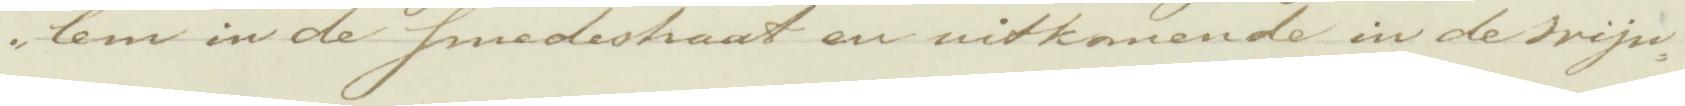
„ lem in de smedestraat en uitkomende in de wijn„
